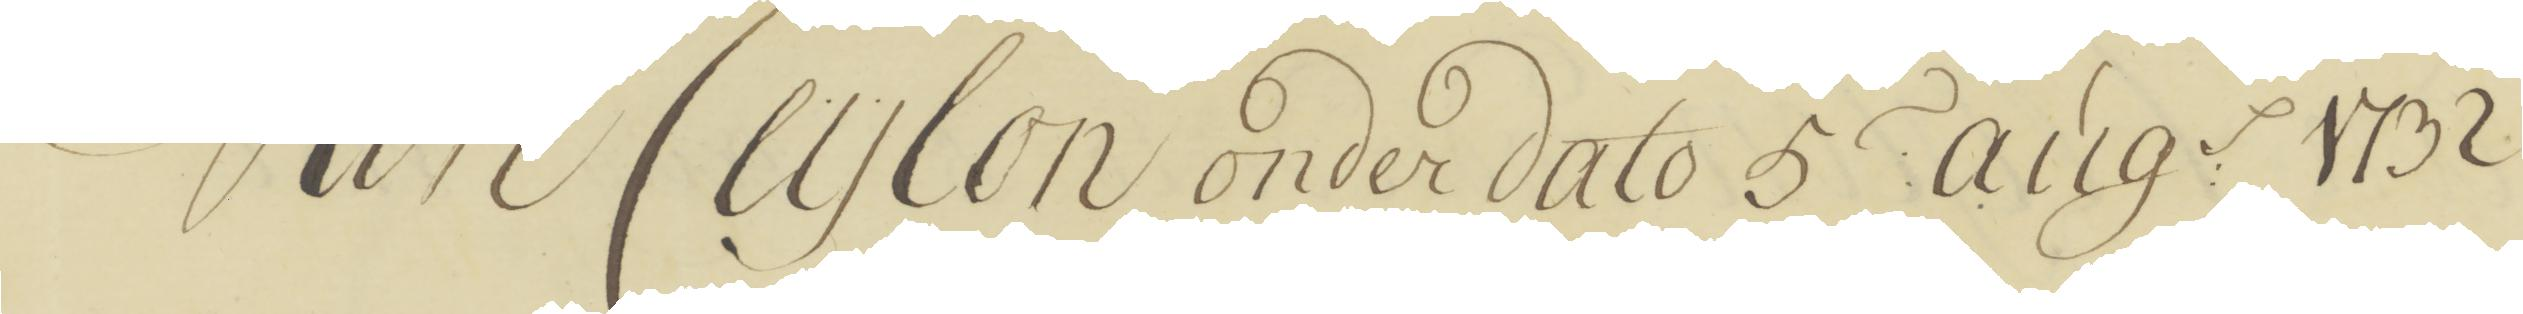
Van Ceijlon onder dato 5:e aug„s 1732
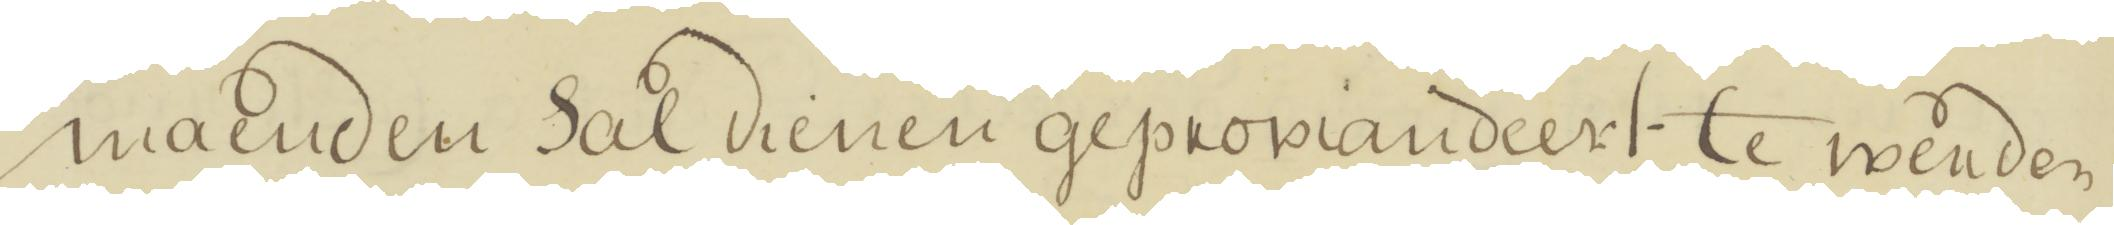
maenden Sal dienen geproviandeert te werden
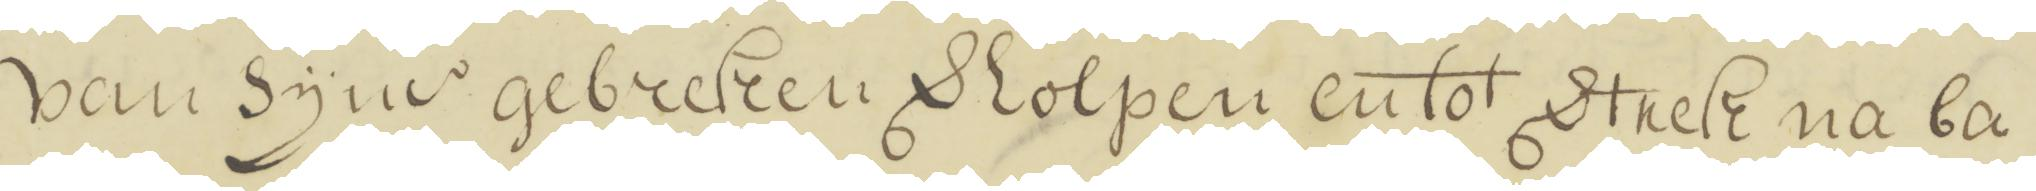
van sijne gebreken verholpen en tot vertrek na ba
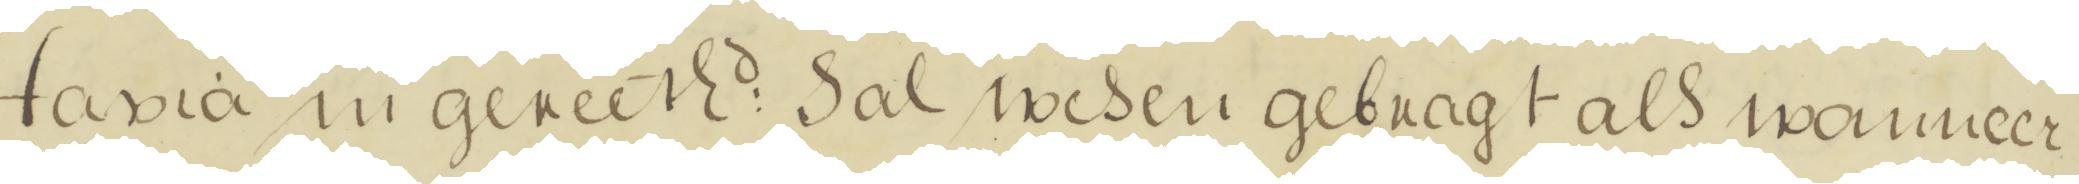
tavia in gereeth:d Sal wesen gebragt als wanneer
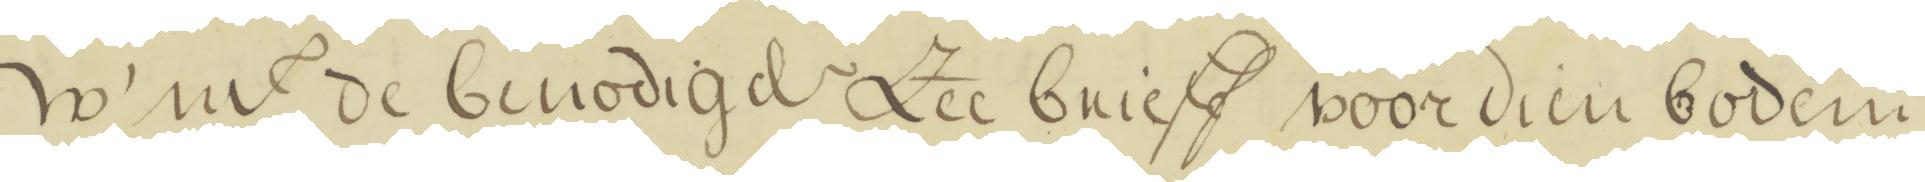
w' uE de benodigde Zee brieff voor dien bodem
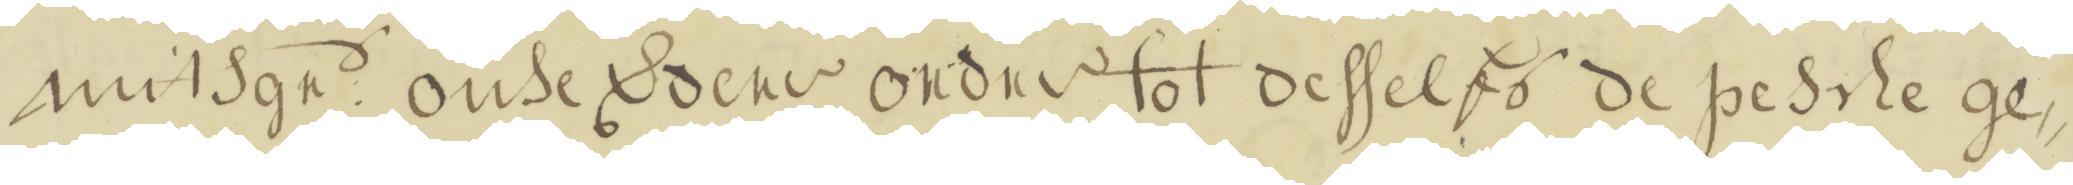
mitsgr:s onse verdere ordre tot desselfs de pesche ge„
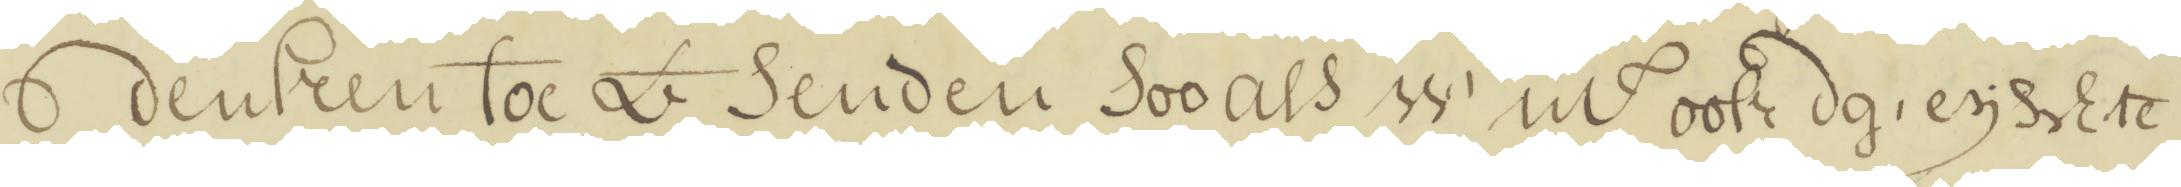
denken toe te Senden Soo als w' uE ook dg: eijschte
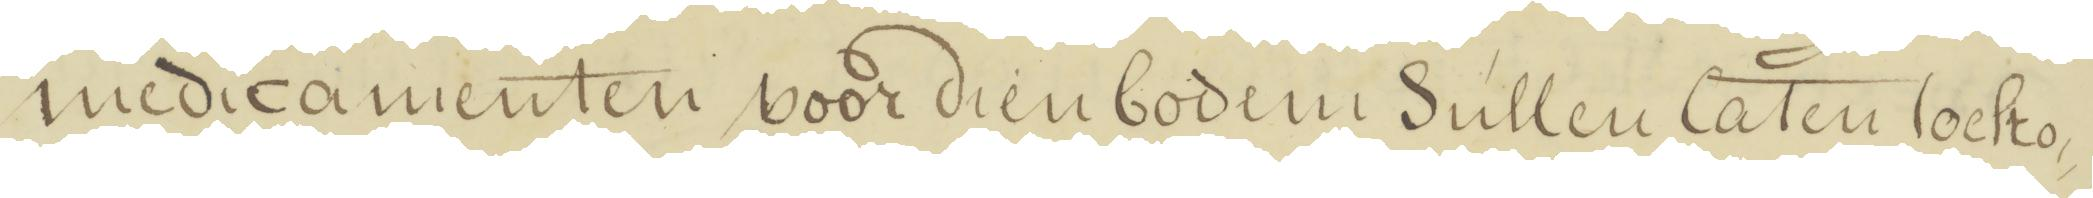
medicamenten voor dien bodem Sullen laten toeko„
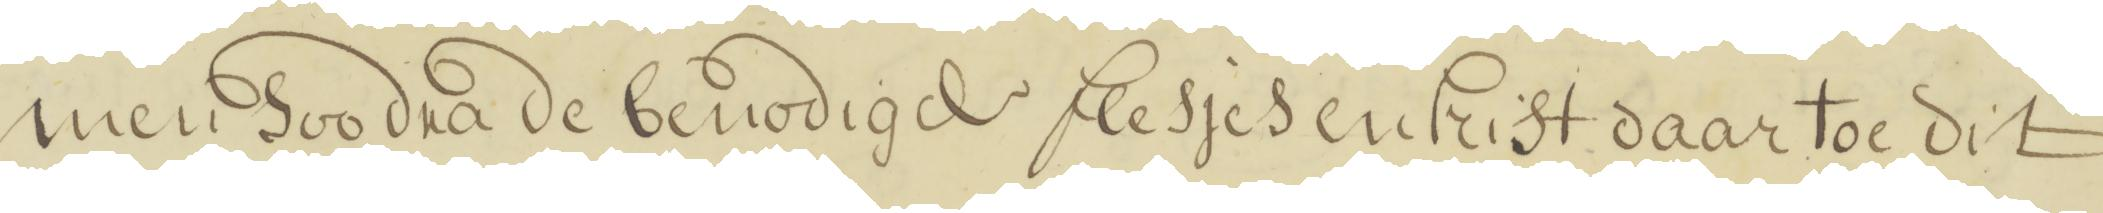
men Soodra de benodigde flesjes en kist daar toe dit
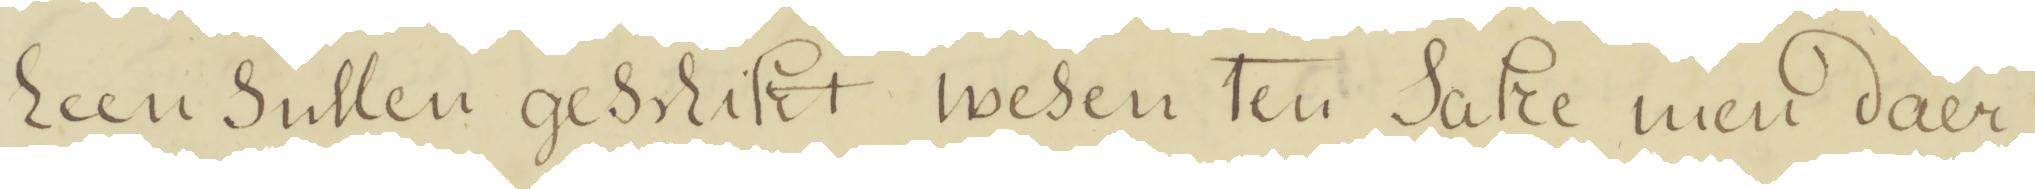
heen sullen geschikt wesen ten Sake men daer
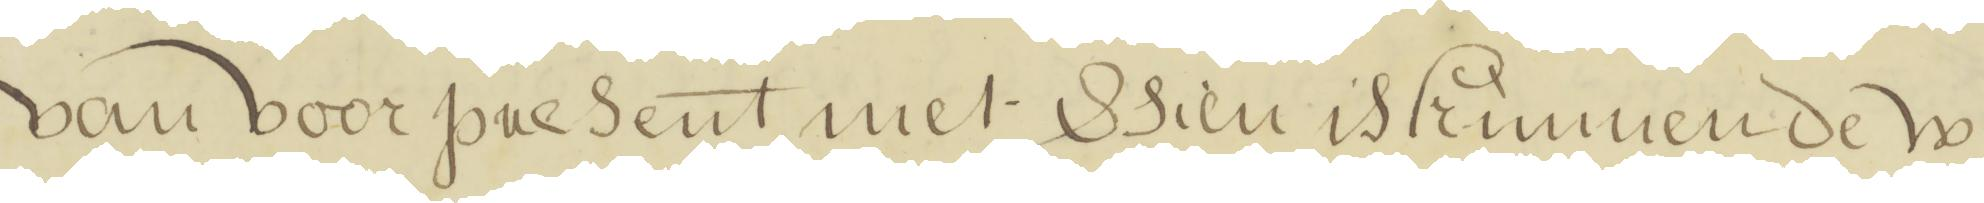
van voor present met versien is kunnen de w'
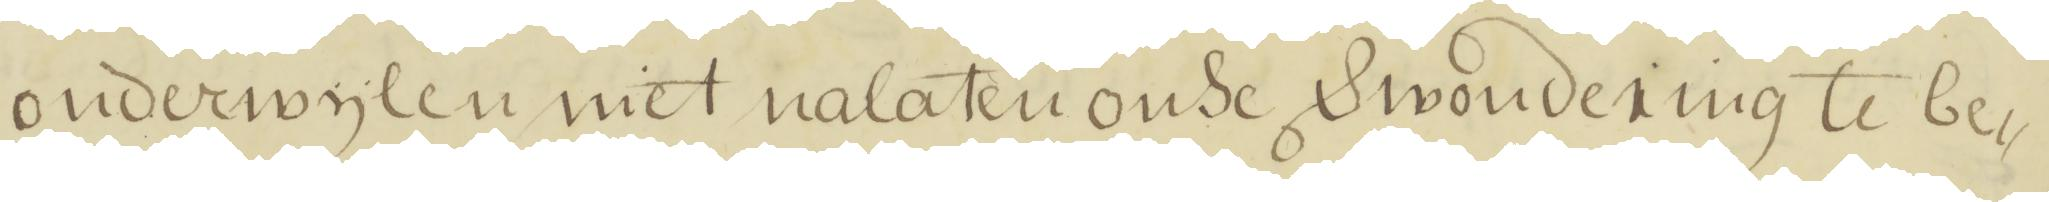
onderwijlen niet nalaten onse verwondering te be
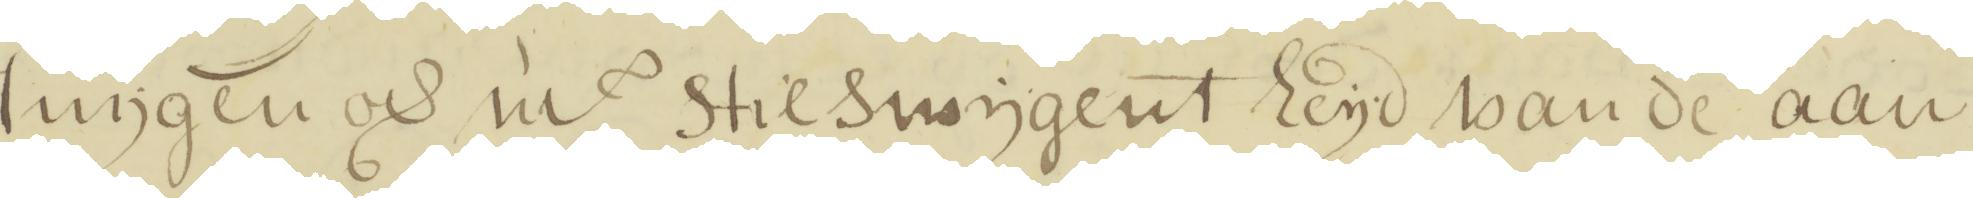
tuijgen over uE stilswijgent heijd van de aan
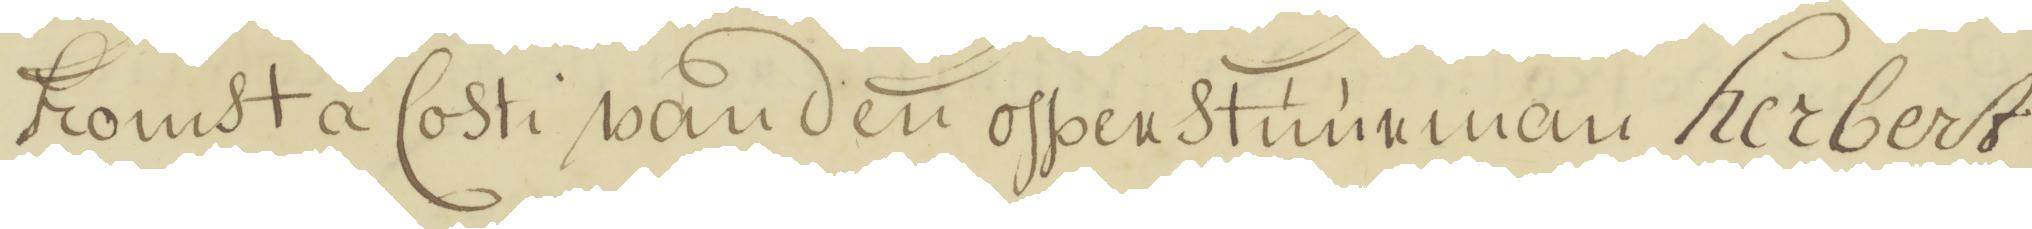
komsta Costi van den opperstuurman herbert
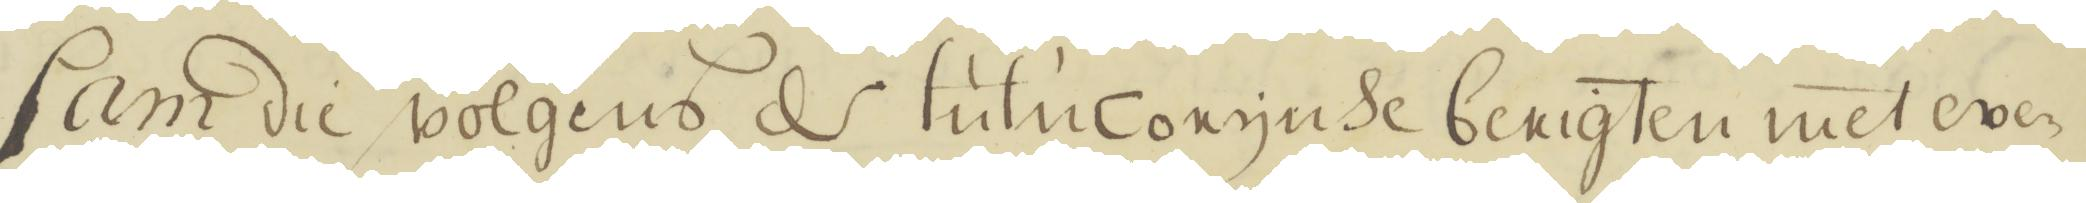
Sam die volgens de tutucorijnse berigten met even
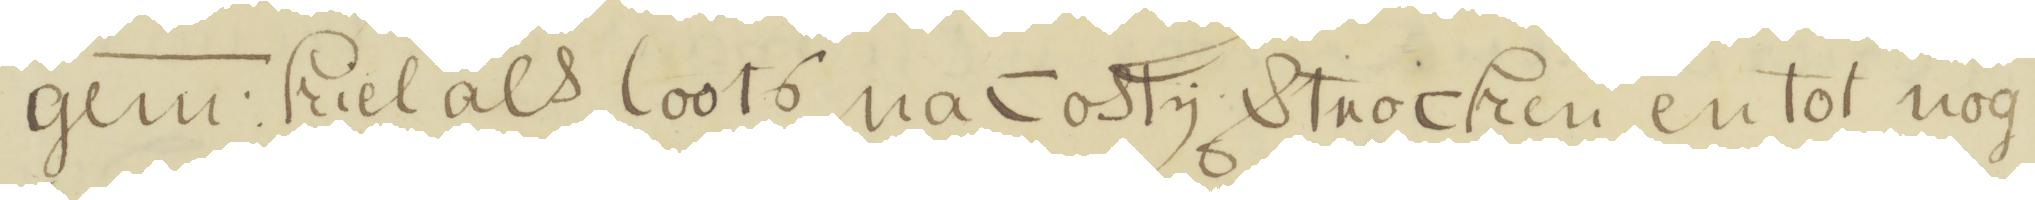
gem: kiel als loots na Costij vertrocken en tot nog
